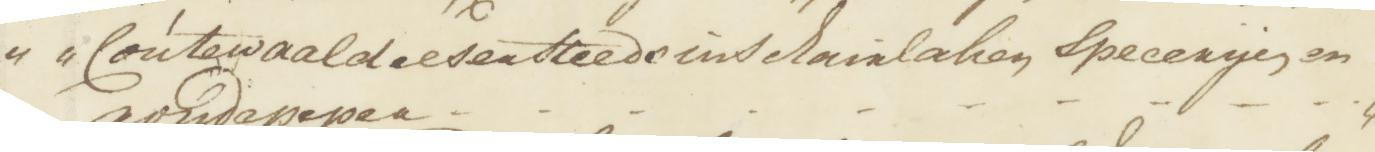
„ „ Coute waal deeser steede in schairlaken specerijen en
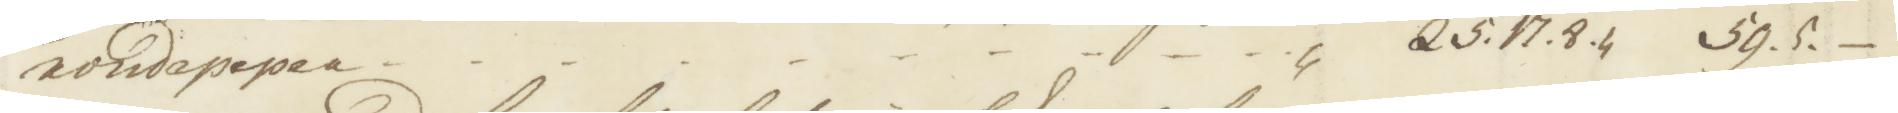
ronde peper - - - . - - - - - - - „ 25. 17. 8. „ 59. 5. —
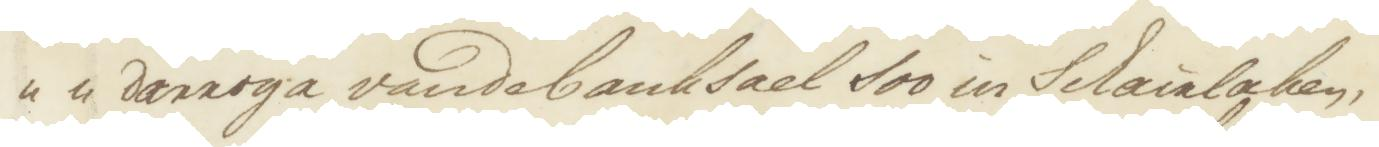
„ „ darroga vande banksael soo in schairlaken,
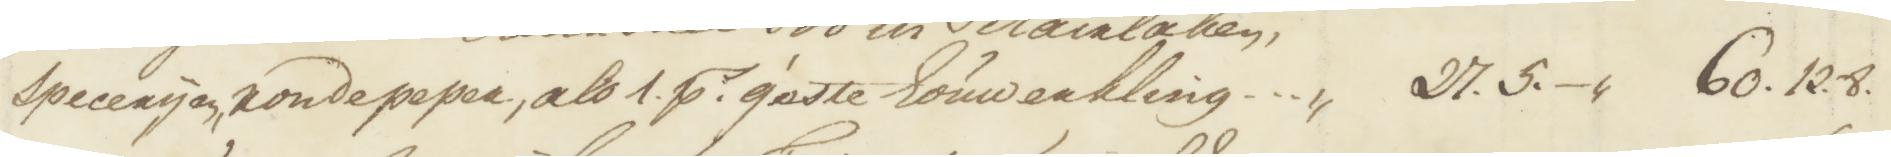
specerijen, ronde peper, als 1. p:s g'este houwerkling - - - „ 27. 5. — „ 60. 12. 8.
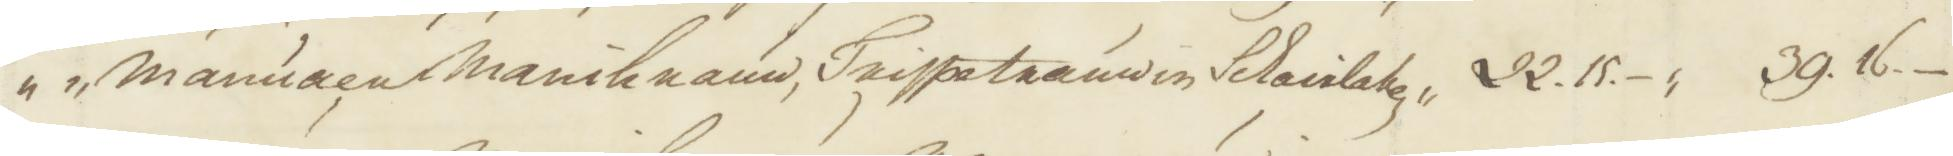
„ „ manuaer manikrauw, Trippetrauw in schairlaken „ 22. 15. — „ 39. 16. —
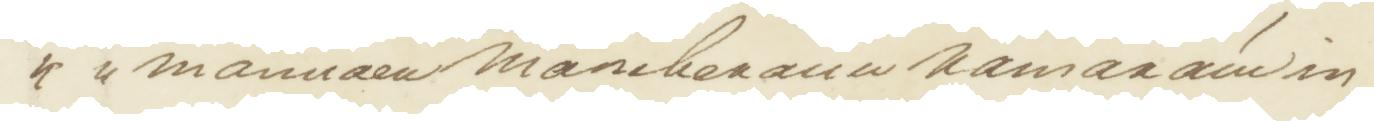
„ „ manuaer manikerauw ramarauw in
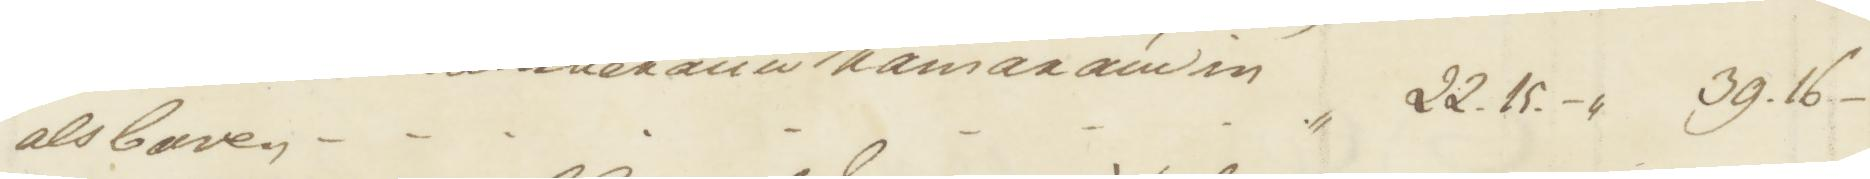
als boven - - . . - - - - „ 22. 15. — „ 39. 16. —
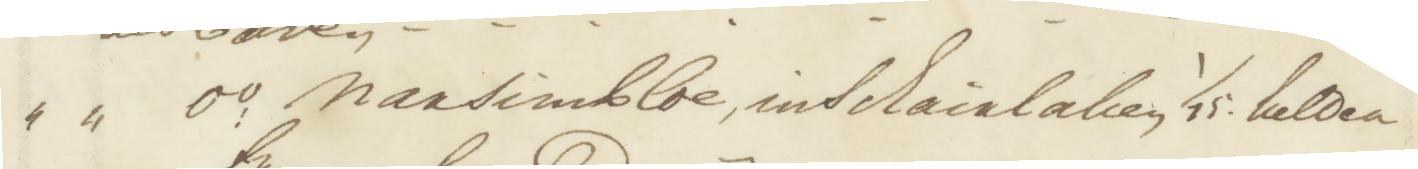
„ „ o:o narsimbloe, in schairlaken 1/15. kelder
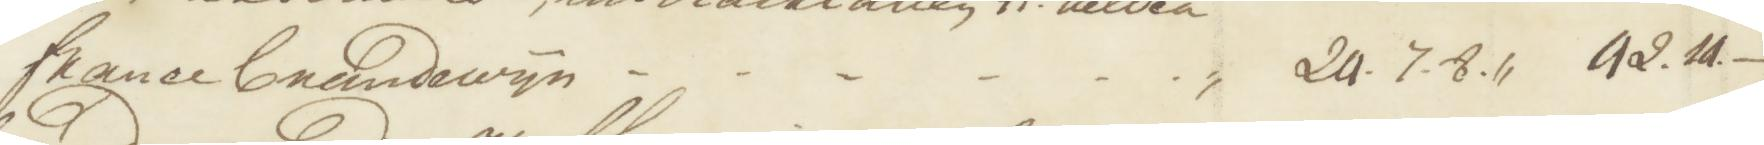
france brandewijn - - - - - . „ 24. 7. 8. „ 42. 14. —
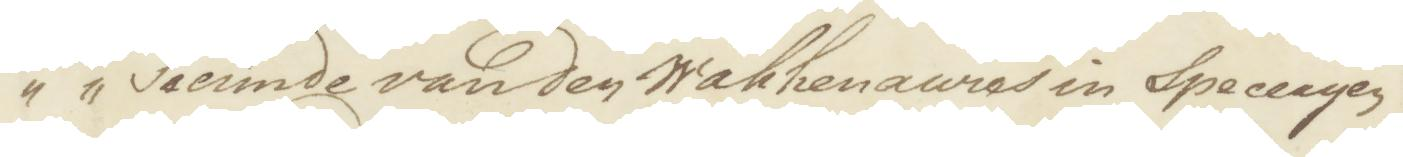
„ „ secunde van den wakhenawies in specerijen
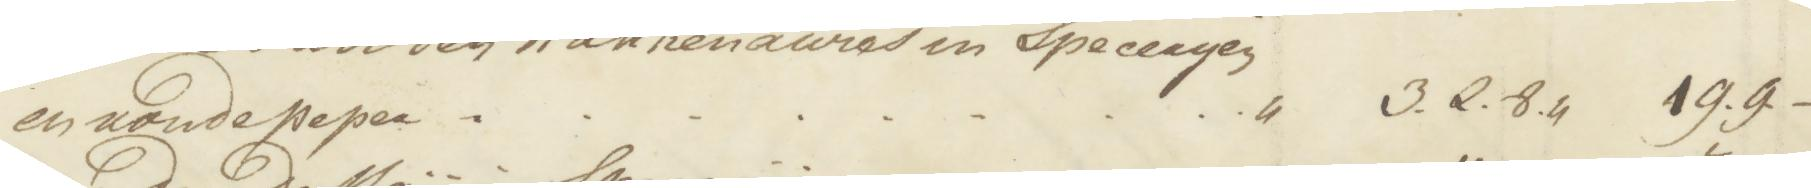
en ronde peper . . . . - . . . „ 3. 2. 8. „ 19. 9.
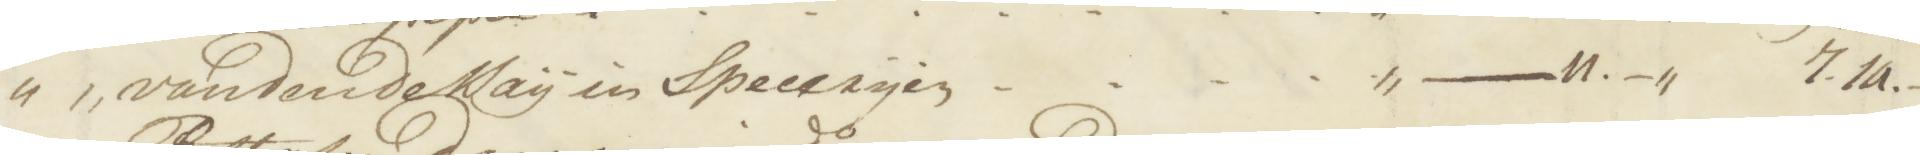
„ „ van den dessaij in specerijen - - - . . „ — 11. — „ 7. 14.
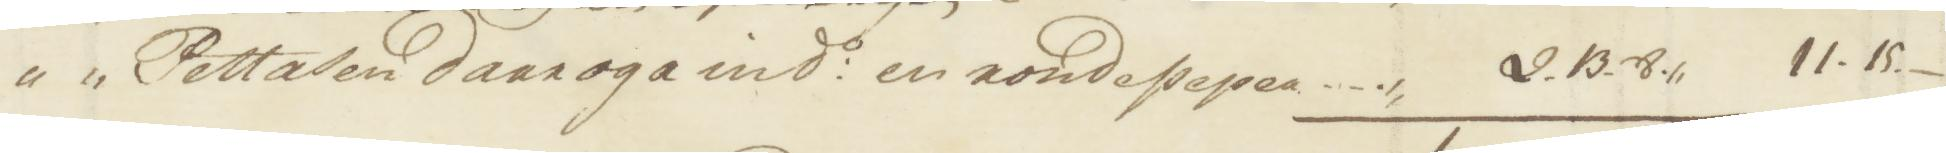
„ „ Pettasen daaroga in d:o en ronde peper - . - . „ 2. 13. 8. „ 11. 15. —
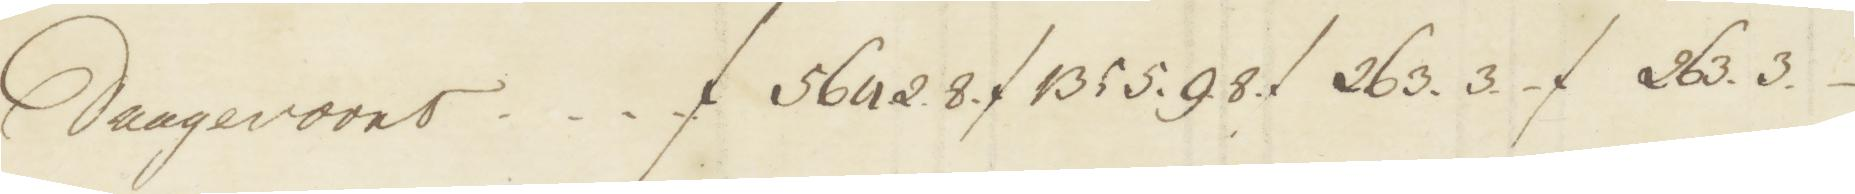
daagevoors - - - ƒ 564. 2. 8. ƒ 1355. 9. 8. ƒ 263. 3. — ƒ 263. 3. —
